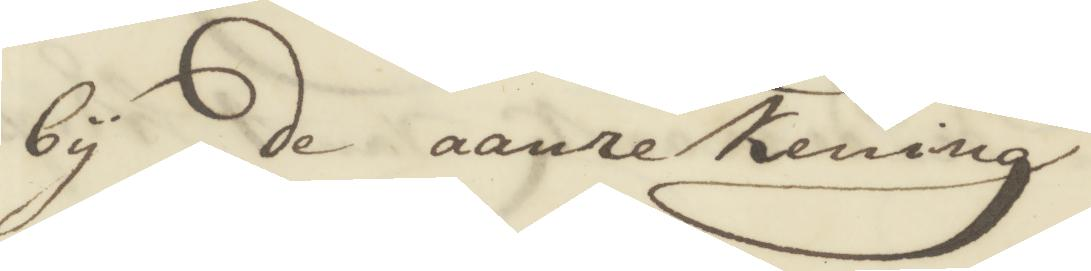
bij de aanrekening
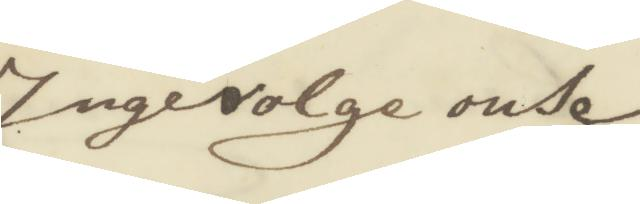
Jngevolge onse
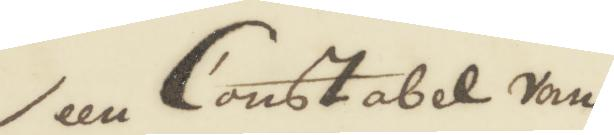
een Constabel van
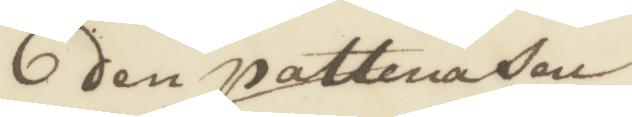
den pattenasen
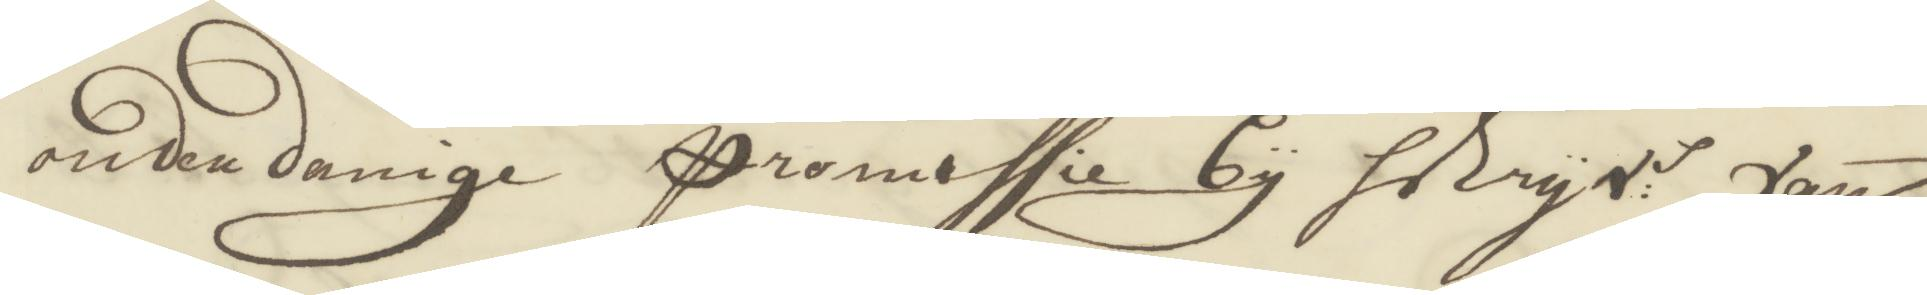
onderdanige promessie bij schrijv:s van
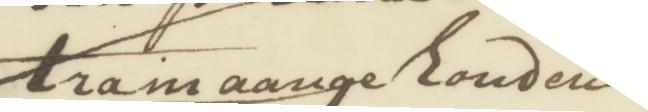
train aangehouden
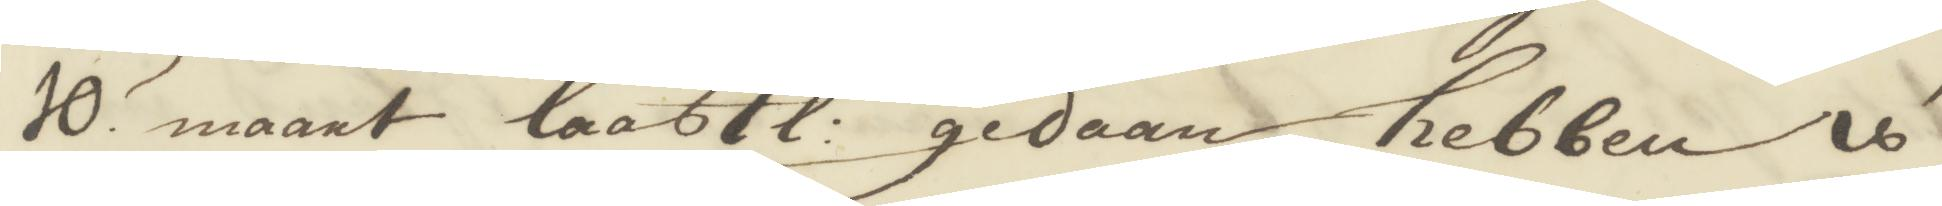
10.' maart laastl: gedaan hebben w'
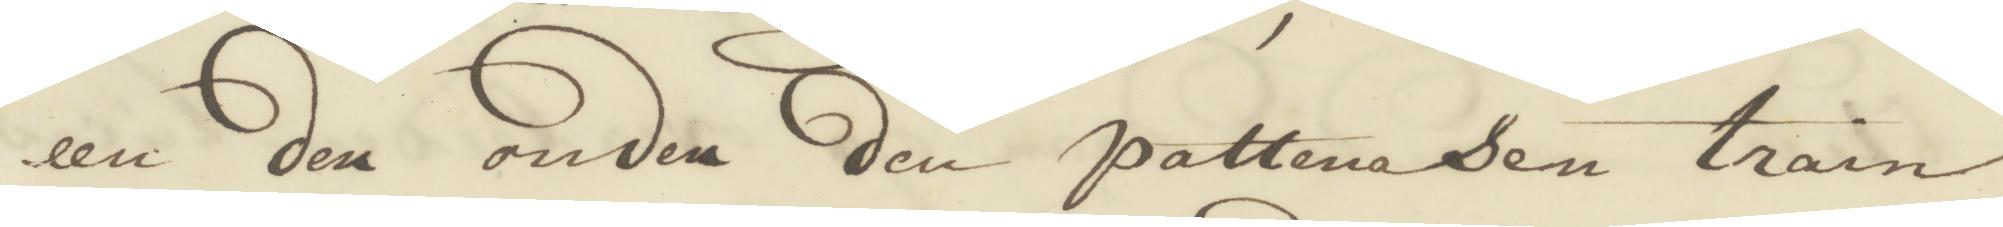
een der onder den pattinesen train
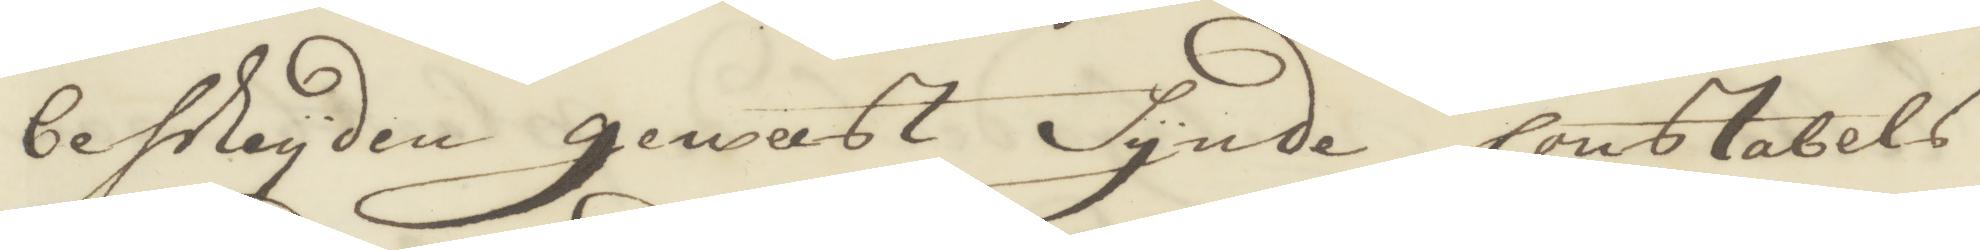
bescheijden geweest Sijnde constabels
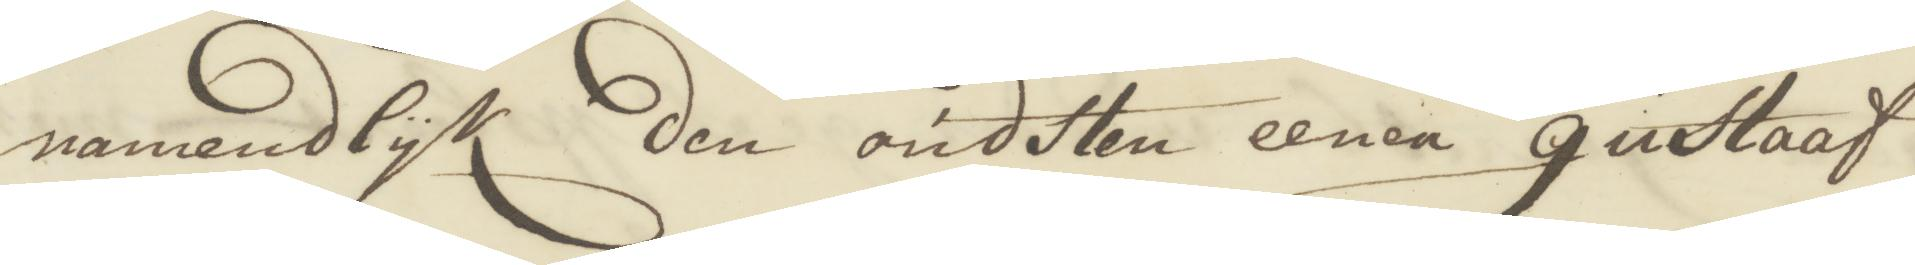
namendlijk den oudsten eenen gustaaf
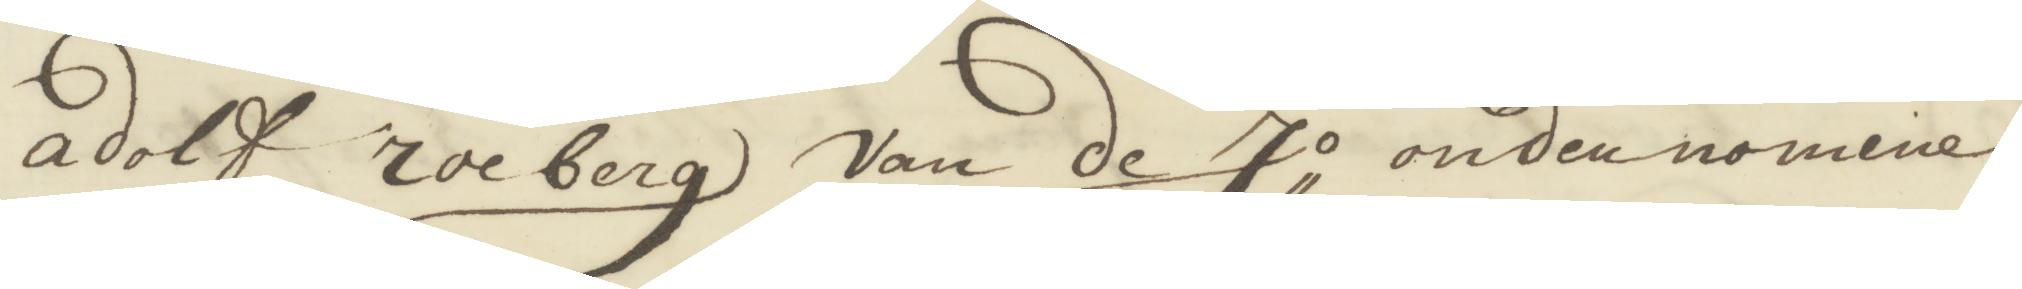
adolf roeberg van de J„o ondernomene
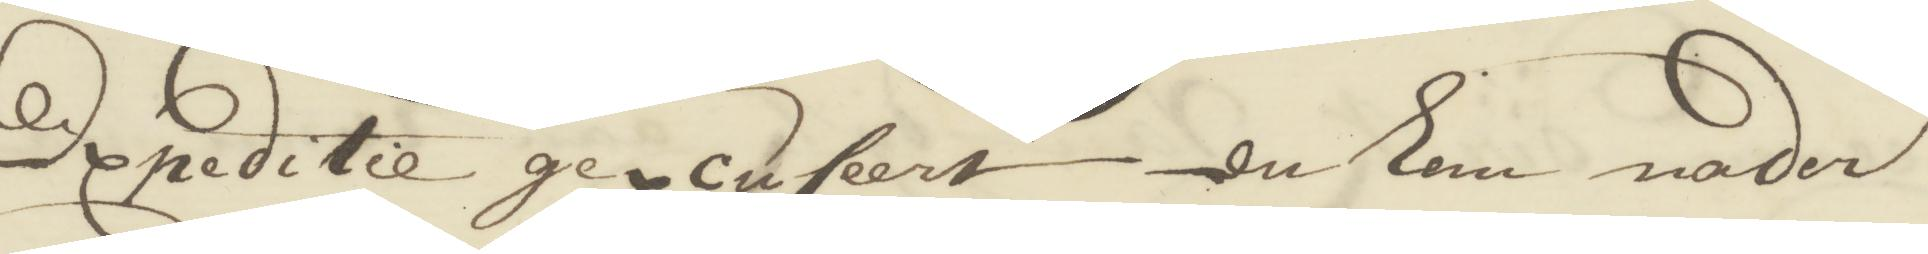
Expeditie gexcuseert en hem nader
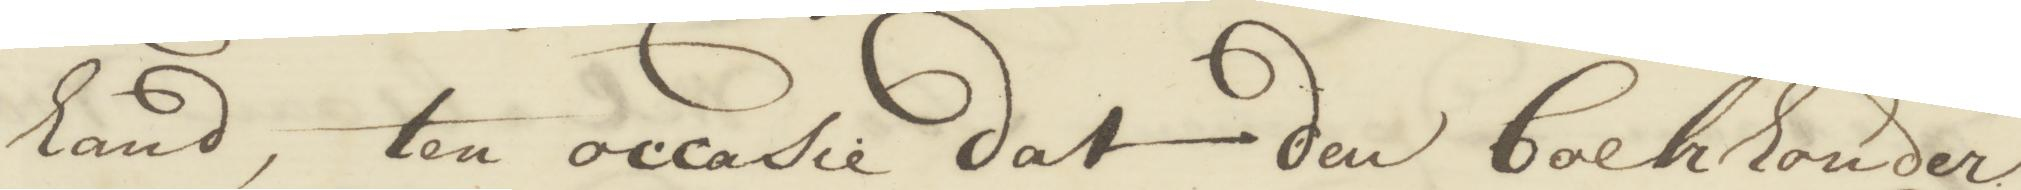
hand, ter occasie dat den boekhouder
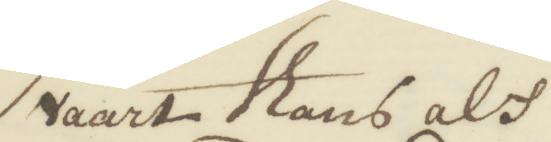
vaart thans als
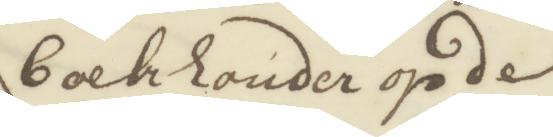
boekhouder op de
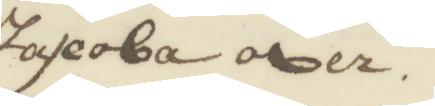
Jacoba over.
